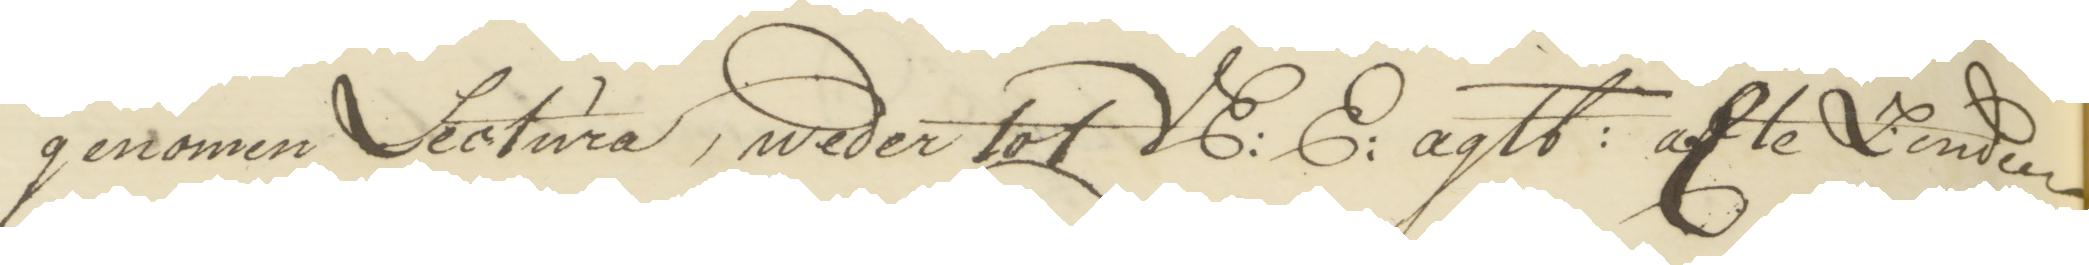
genomen Lectura, weder tot VE: E: agtb: af te zenden
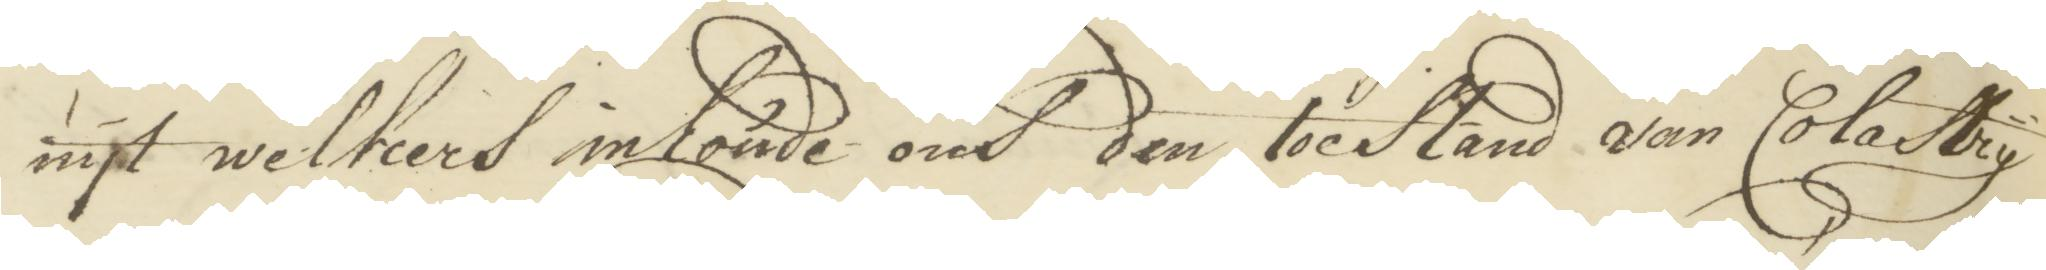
uijt welkers inhoude ons den toestand van Colastrij
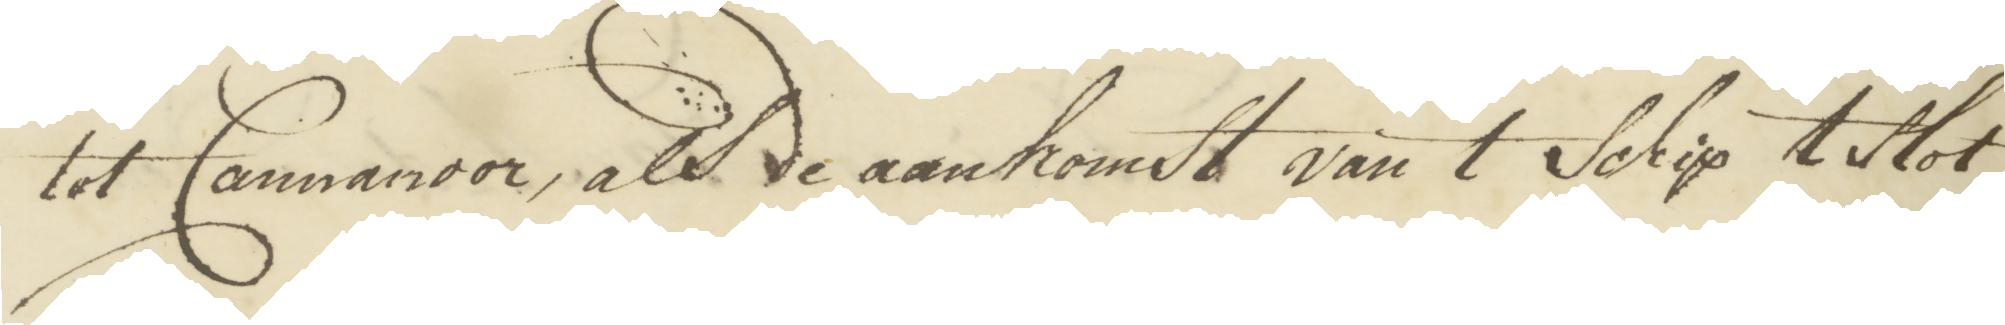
tot Cannanoor, als de aankomst van ’t schip ’t slot
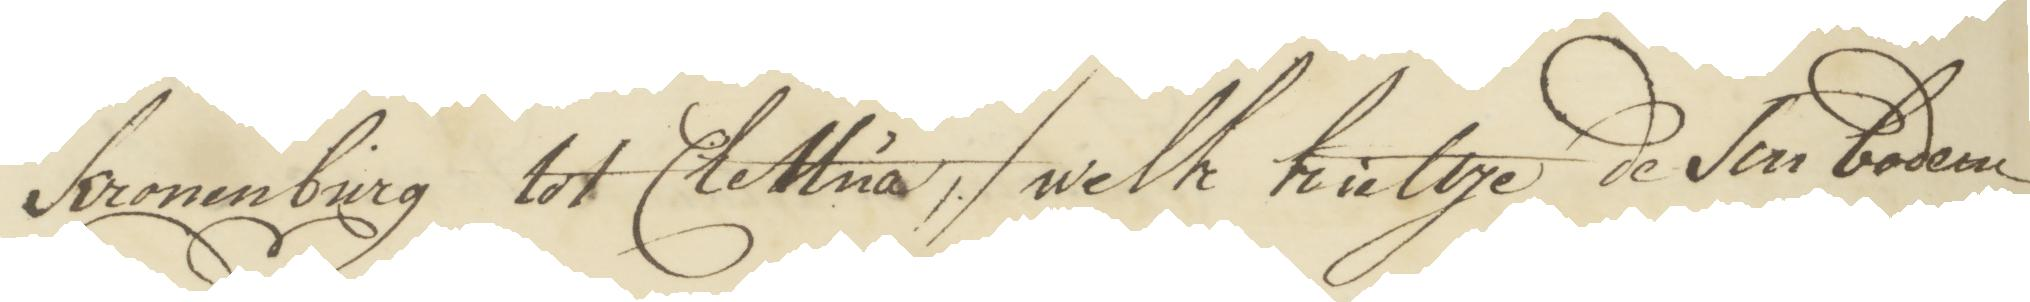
kronenburg tot Chettua, /welk kieltje desen bodem
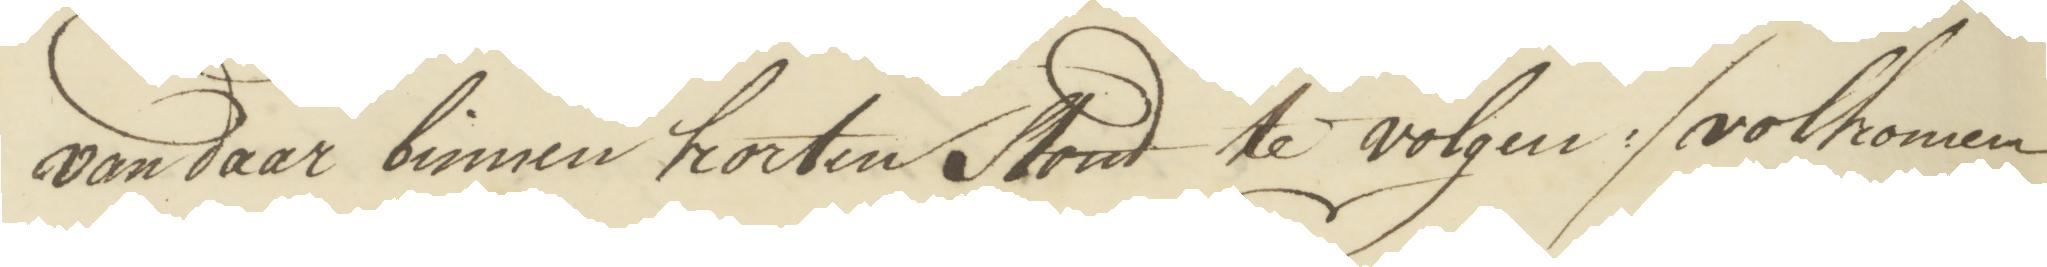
van daar binnen korten stont te volgen : /volkomen
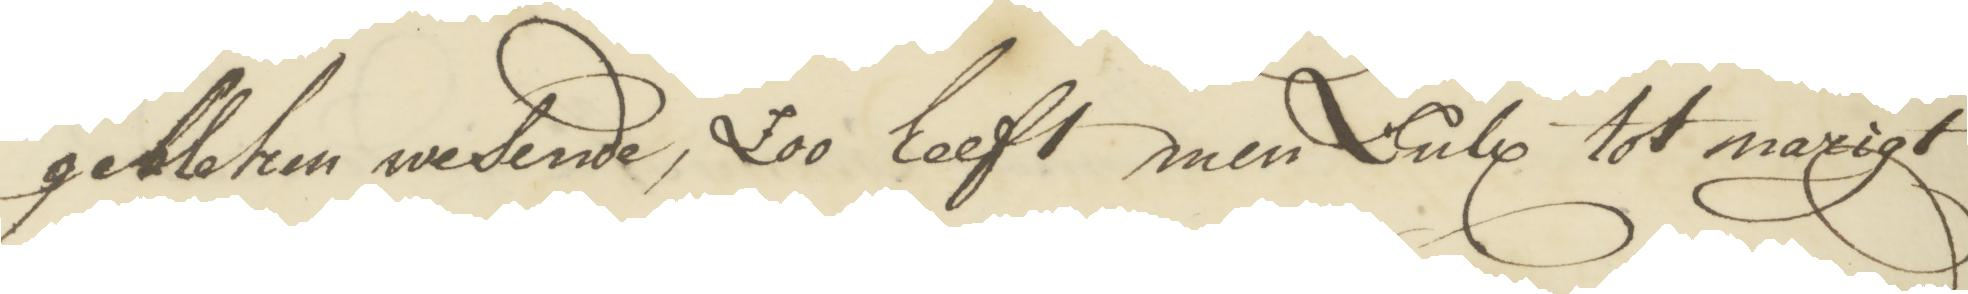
gebleken wesende, zoo heeft men zulx tot narigt
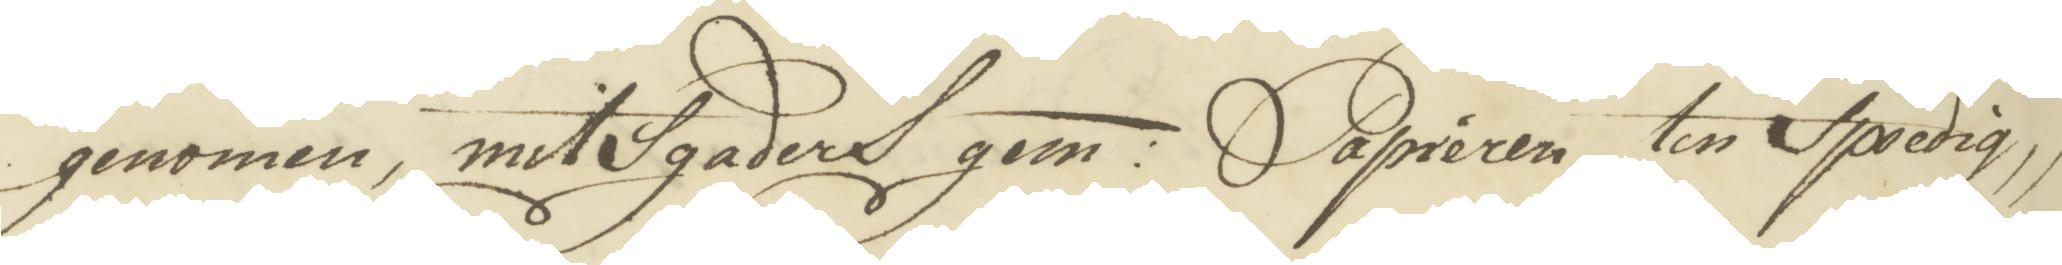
genomen, mitsgaders gem: Papieren ten spoedig„
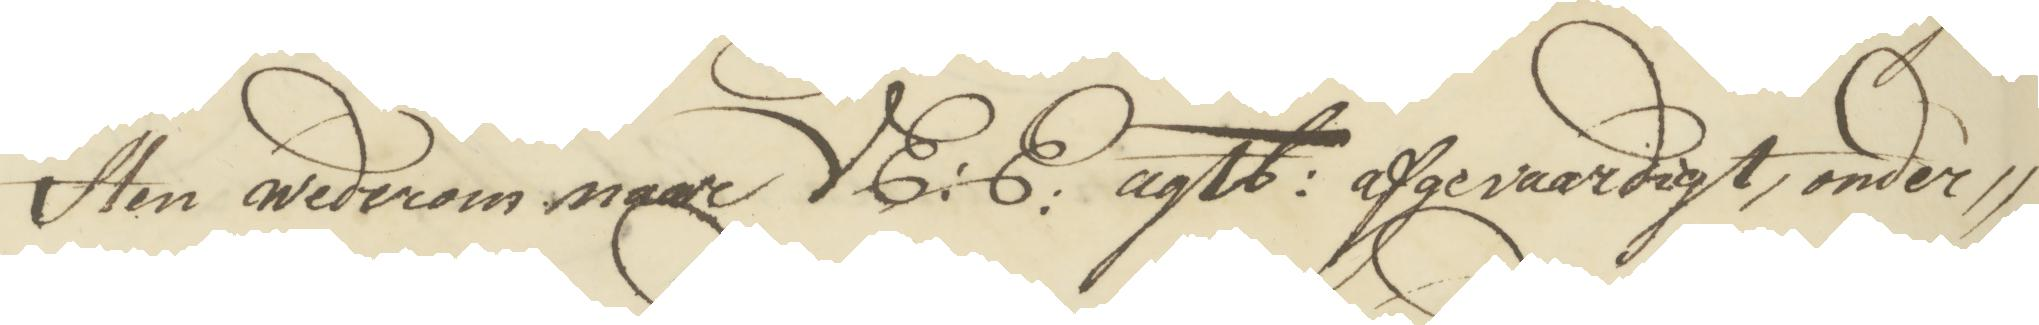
sten wederom naar VE: E: agtb: afgevaardigt, onder„
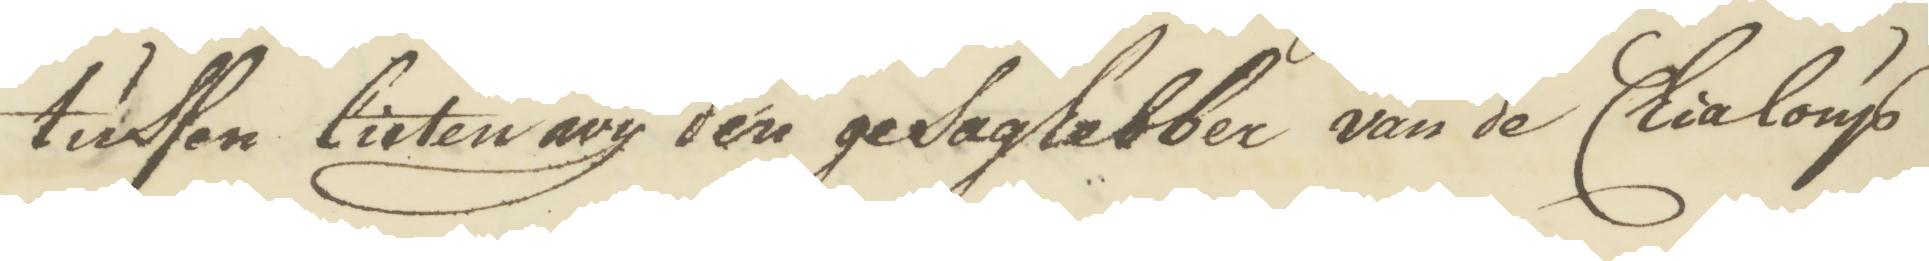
tussen lieten wij den gesaghebber van de Chialoup
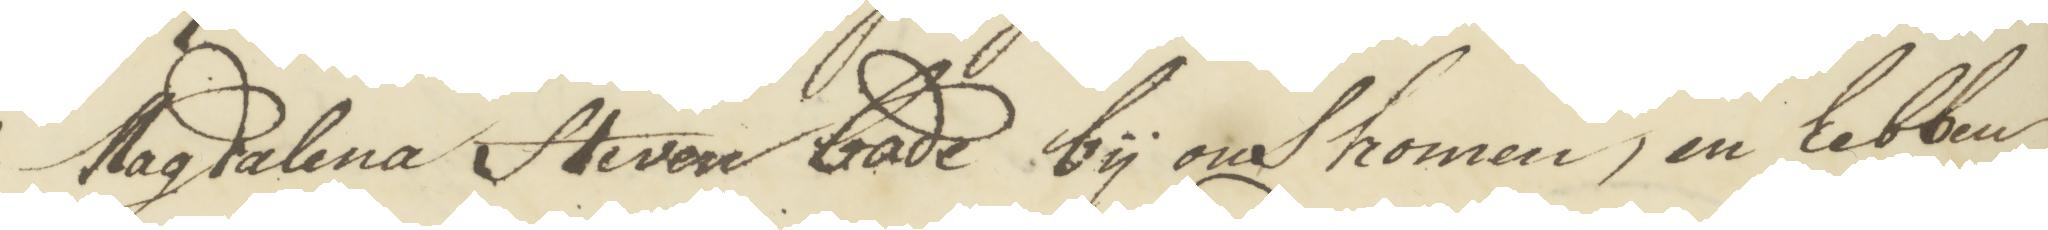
Magdalena Steven bode bij ons komen, en hebben
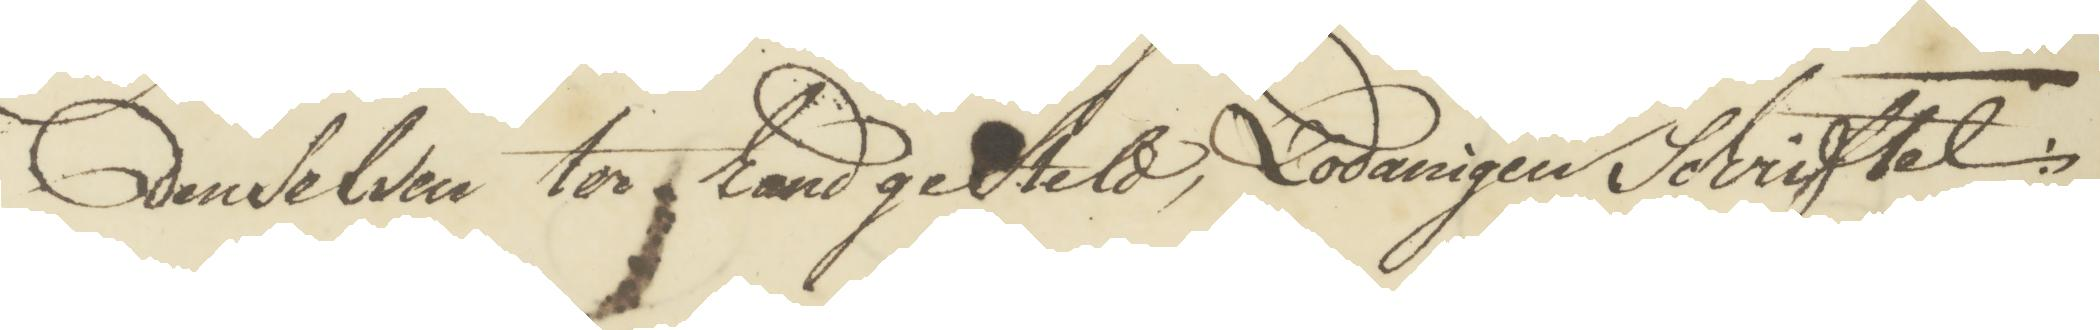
denselven ter hand gesteld, zodanigen schriftel:
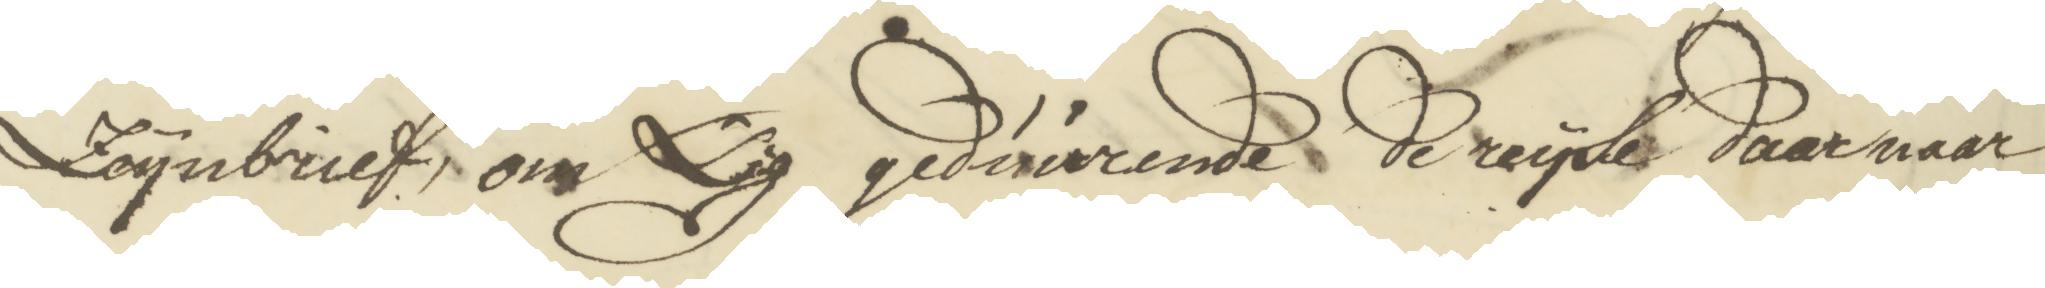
zeijnbrief, om zig geduurende de reijse daar naar
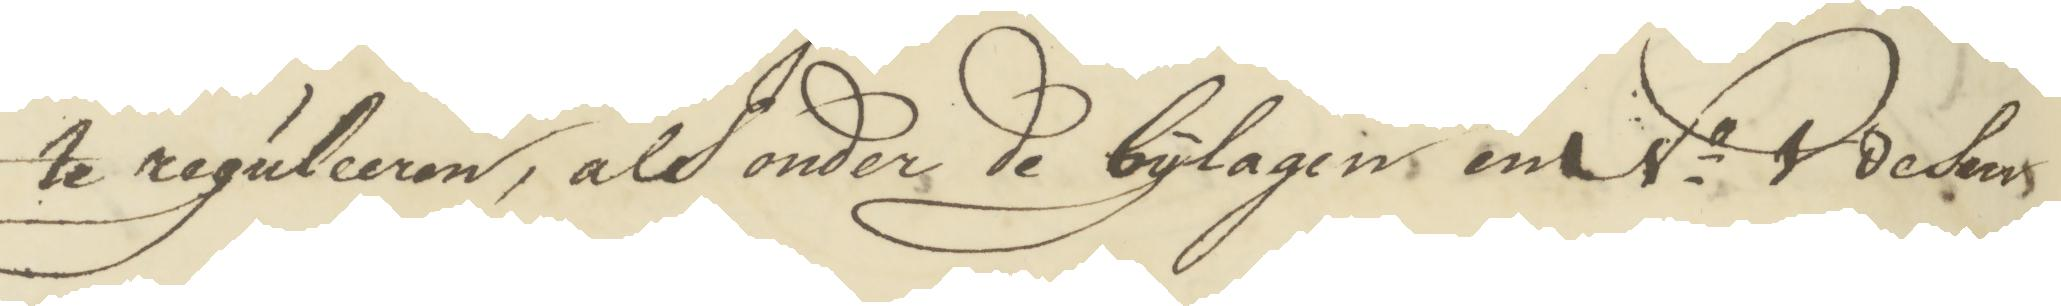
te reguleeren, als onder de bijlagen en N=o 1 desen
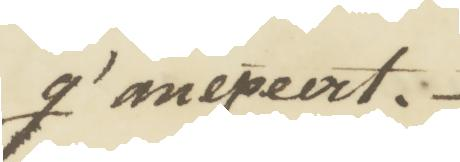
g'anexeert.
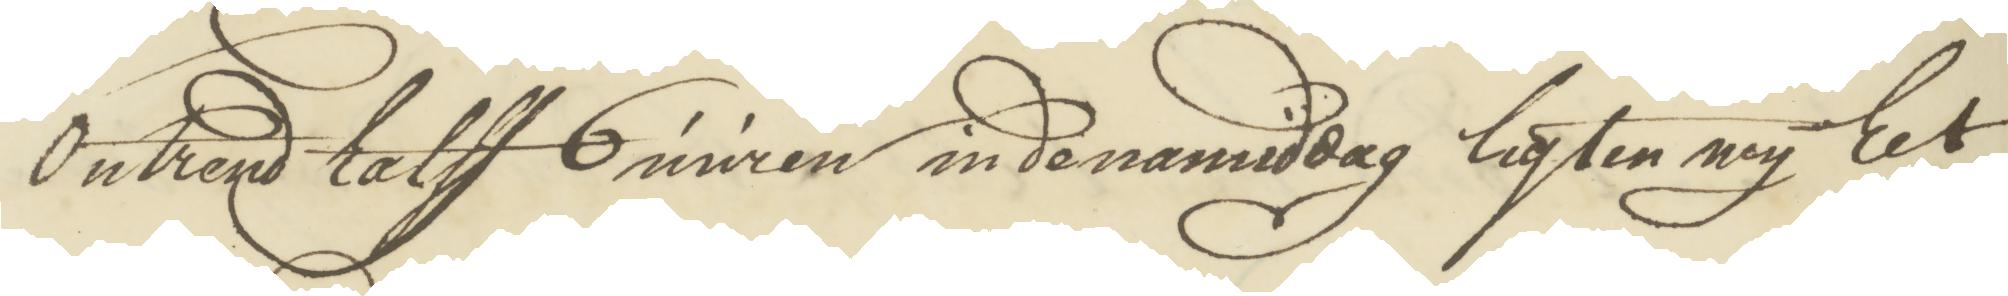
Ontrend halff 6 uuren indenamiddag ligten wij het
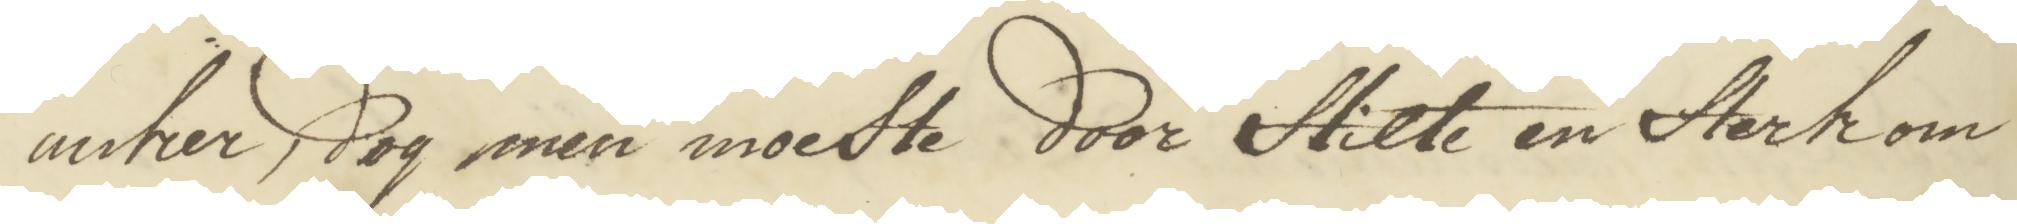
anker, dog men moeste door stilte en sterk om
